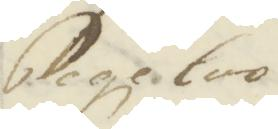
Pegeloo
